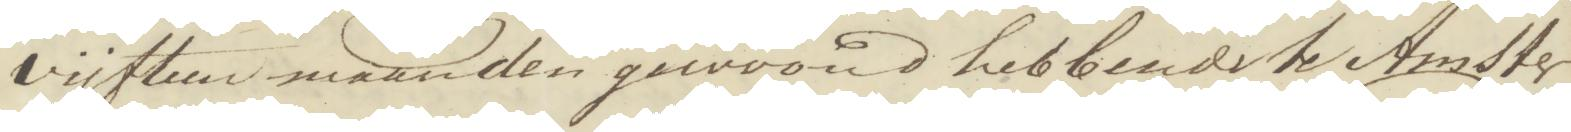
vijftien maanden gewoond hebbende te Amster=
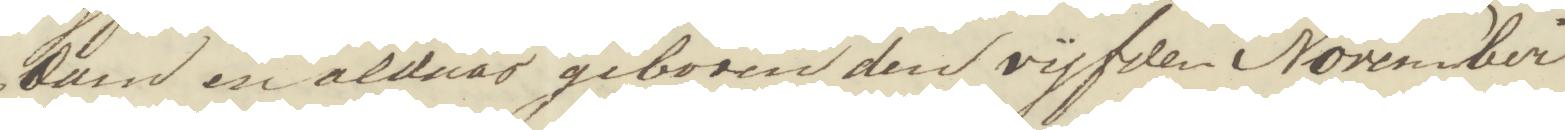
dam en aldaar geboren den vijfden November
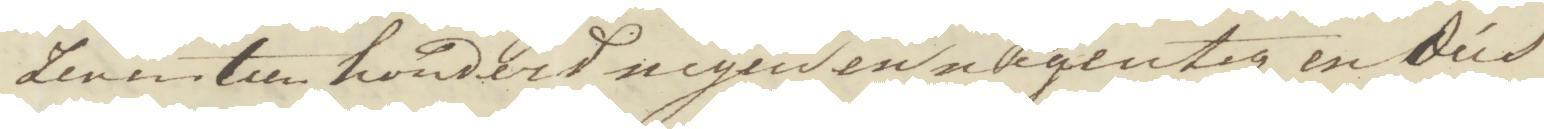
Zeventien honderd negen en negentig en dus
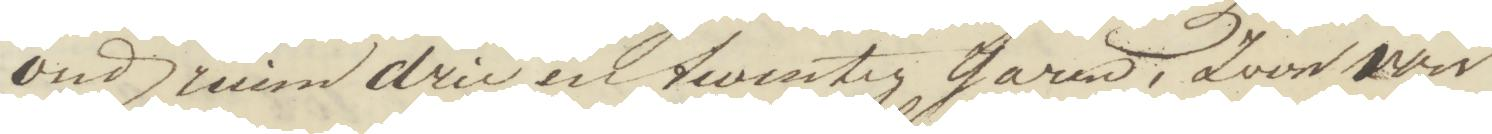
oud ruim drie en twintig Jaren, zoon van
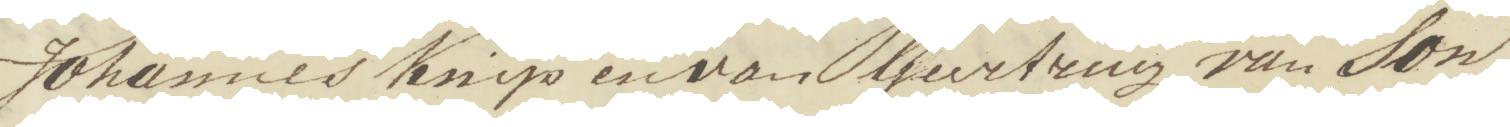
Johannes Knip en van Gertruy van Son,
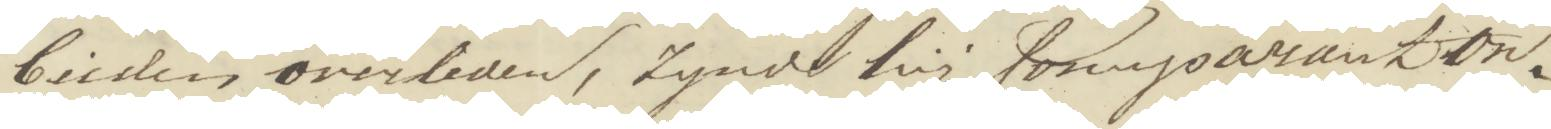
beiden overleden, zynde hij Comparant on„
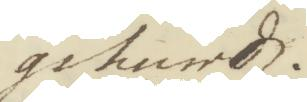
gehuwd.
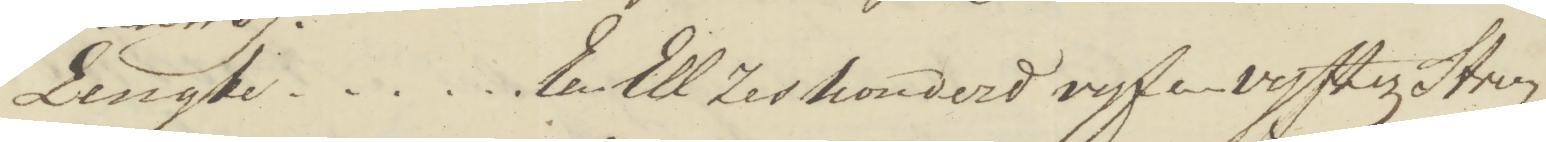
Lengte - - . . . . Een Ell Zes honderd vyf en vyftig strepen
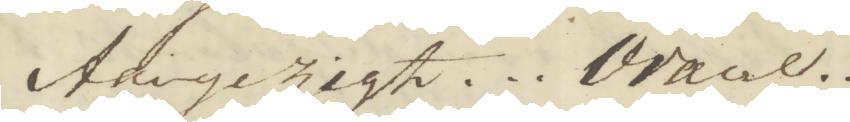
Aangezigt . . . Ovaal.
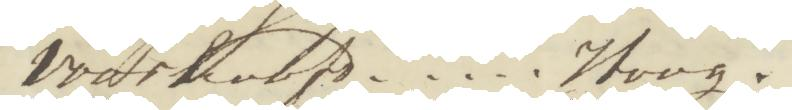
Voorhoofd . . . . . Hoog.
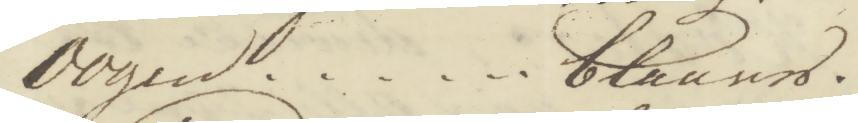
Oogen . . . . - . blaauw.
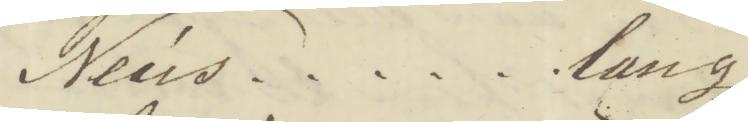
Neus . . . . . . lang
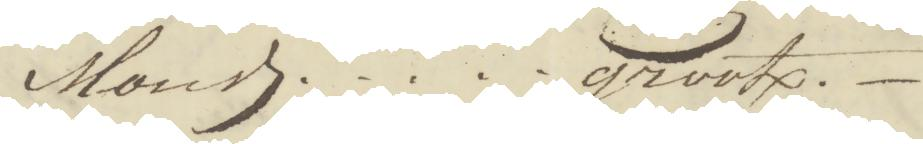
Mond . - . . - groot. —
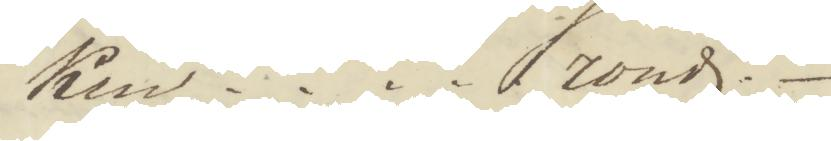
Kin - . . . . rond. —
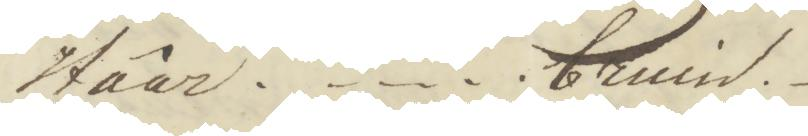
Haar . - - - . bruin. _
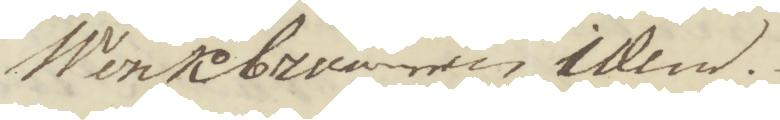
Wenkbrauwen Idem.
